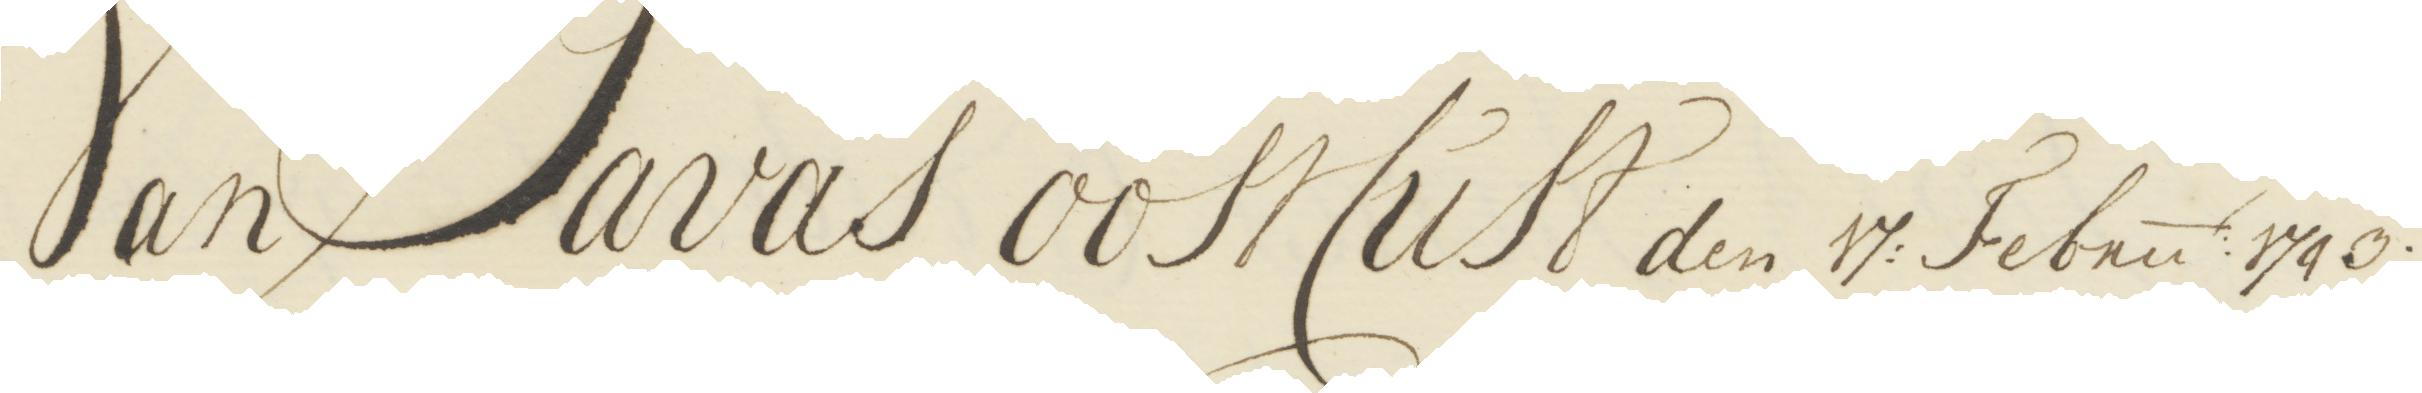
Van Javas oost Cust den 17: Febru: 1743;
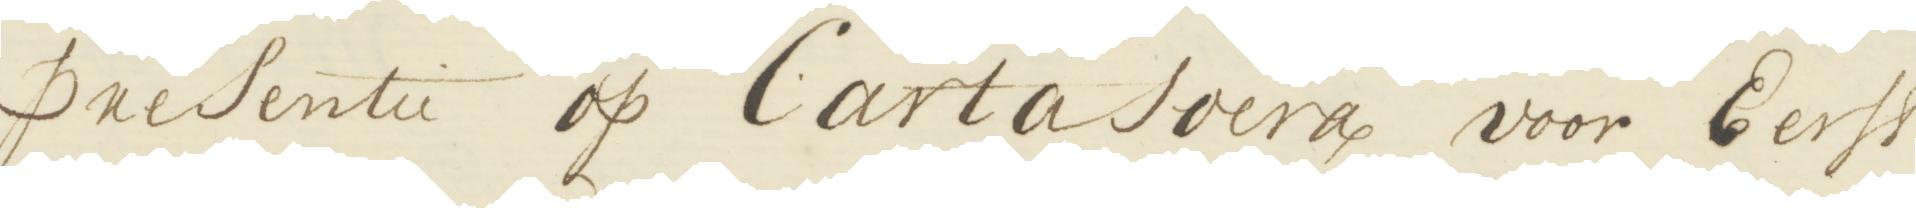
presentie op Cartasoera voor Eerst
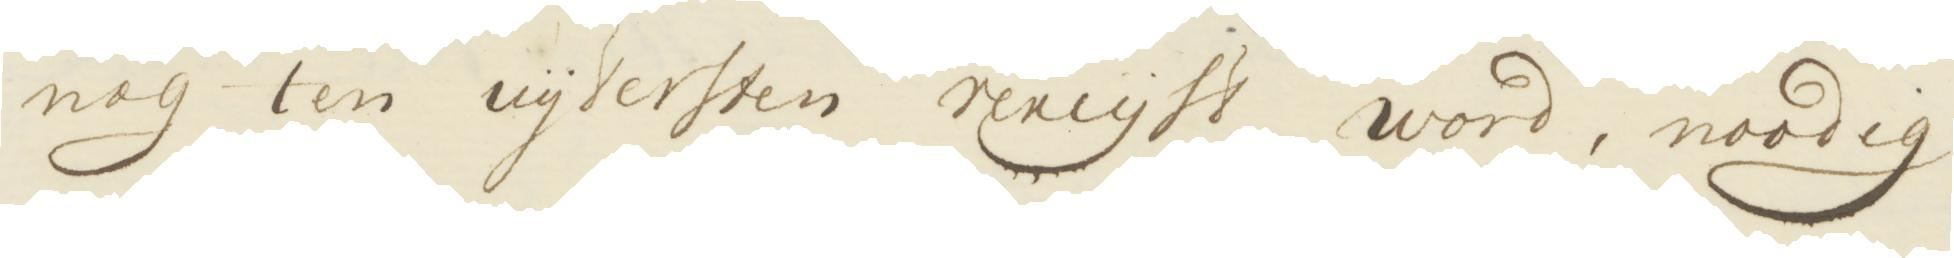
nog ten uijtersten vereijst word, noodig
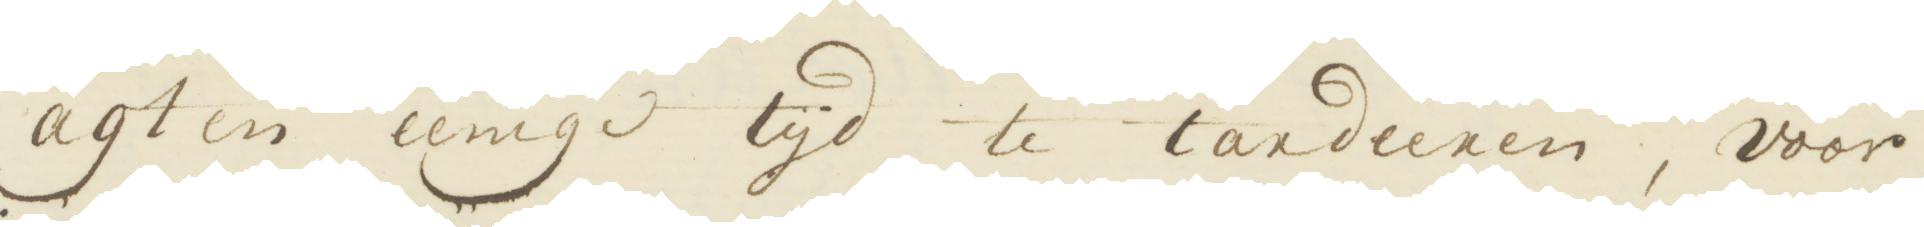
agten eenige tijd te tardeeren, voor
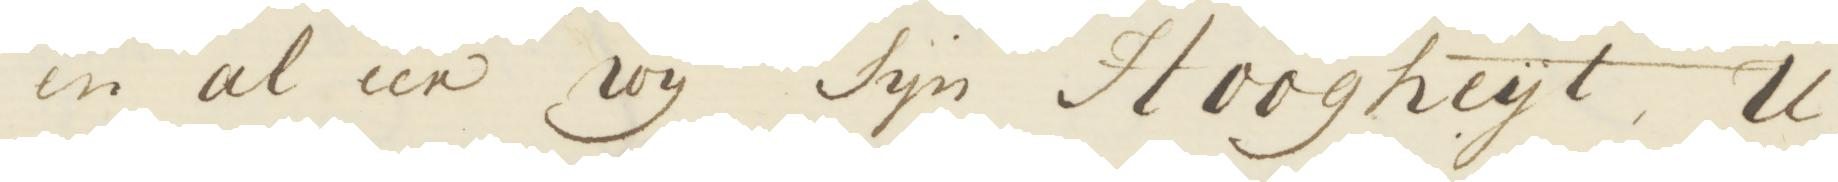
en al eer wij sijn Hoogheijt, U
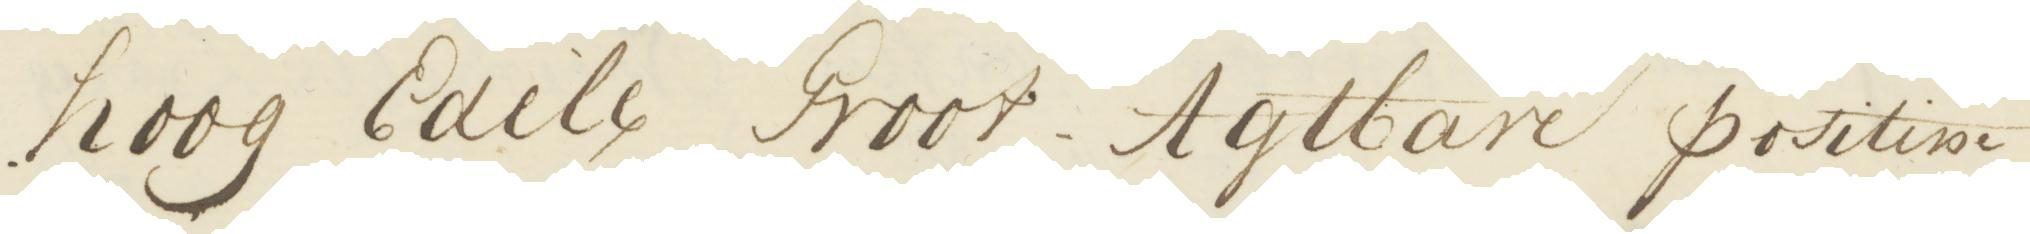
hoog Edele Groot-Agtbare positive
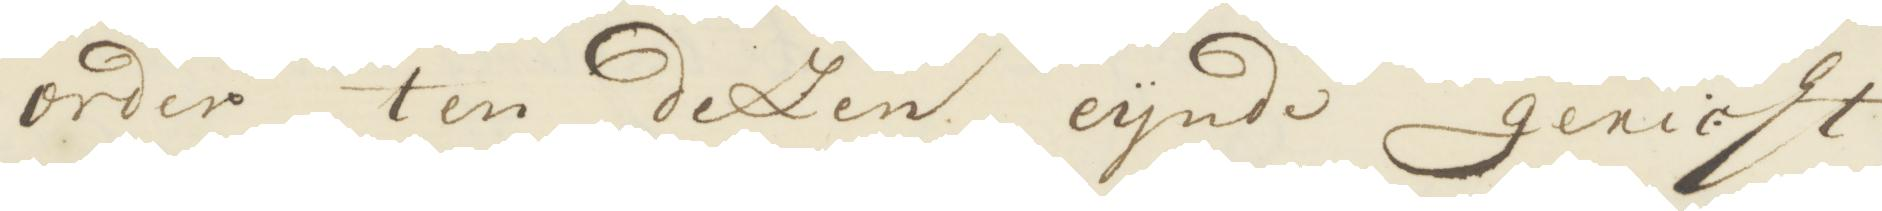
order ten dezen eijnde gericht
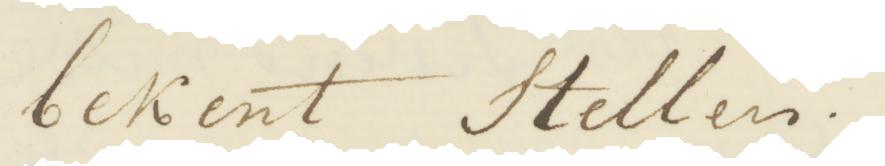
bekent stellen.
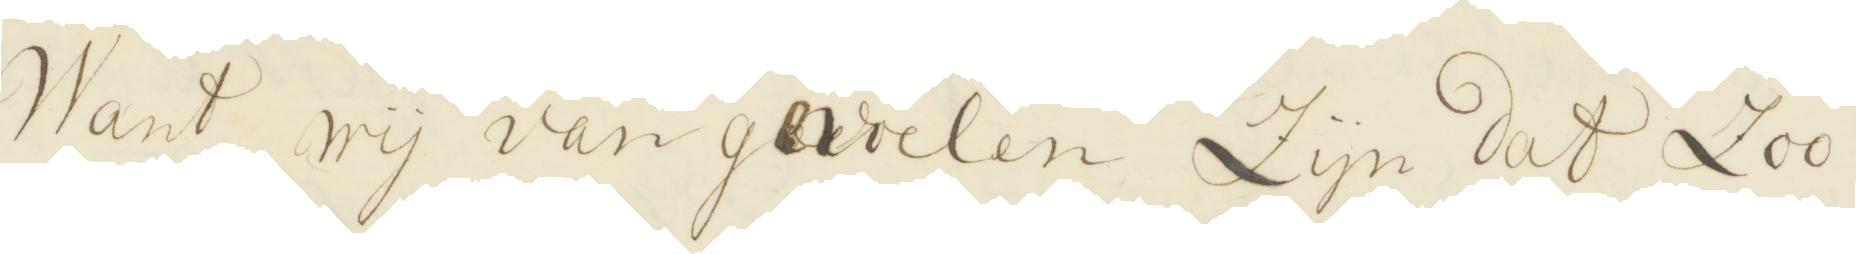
Want wij van gevoelen zijn dat zoo
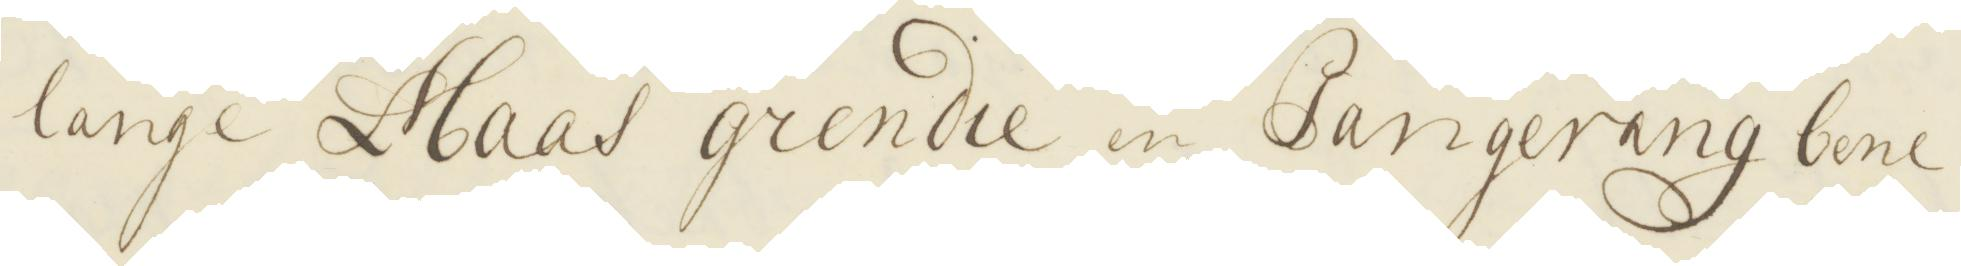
lange Maas grendie en Pangerang bene
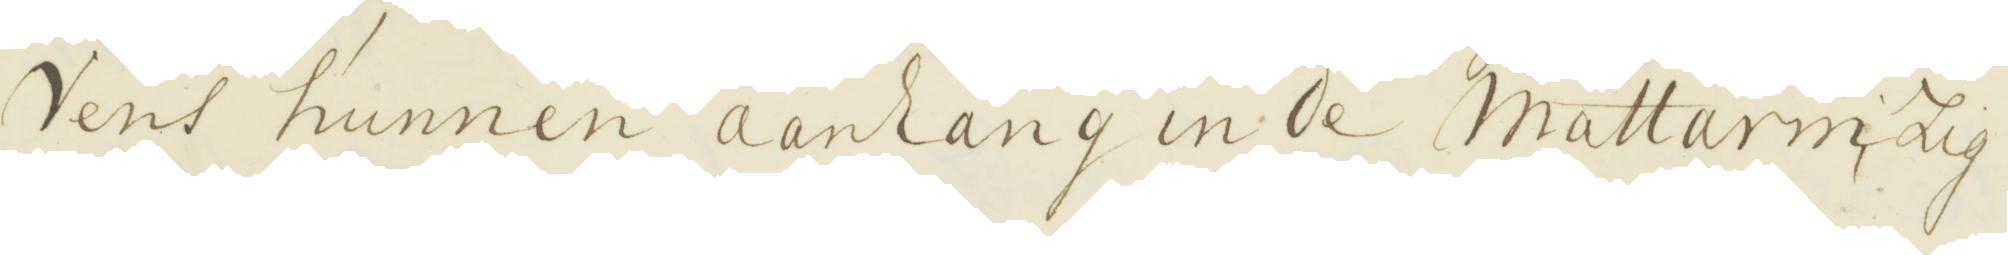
vens hunnen aanhang in de Mattarm zig
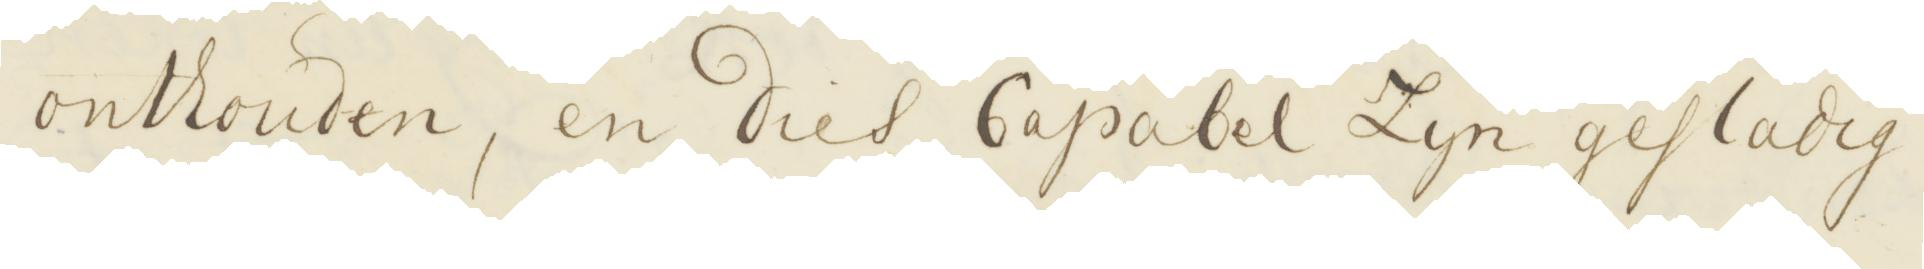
onthouden, en dies capabel zijn gesladig
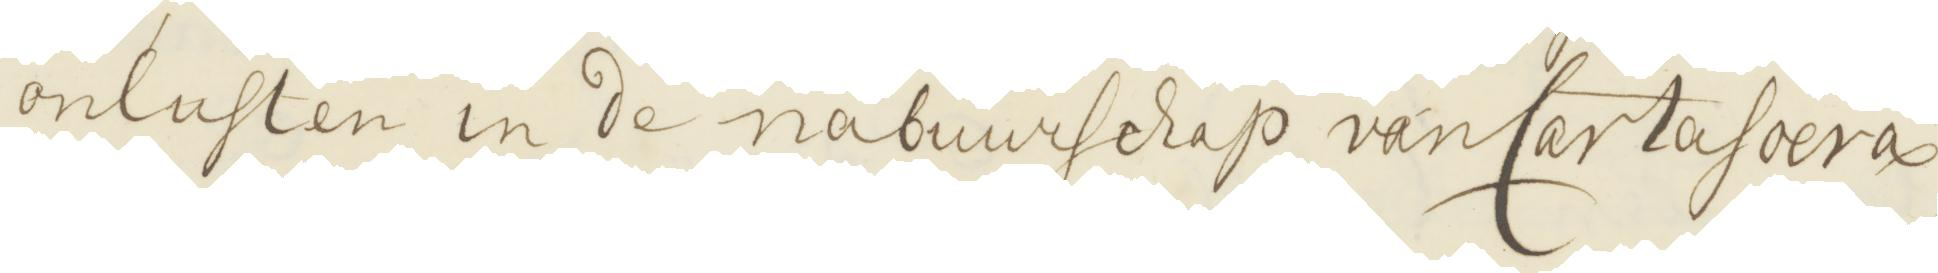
onlusten in de nabuurschap van Cartasoera
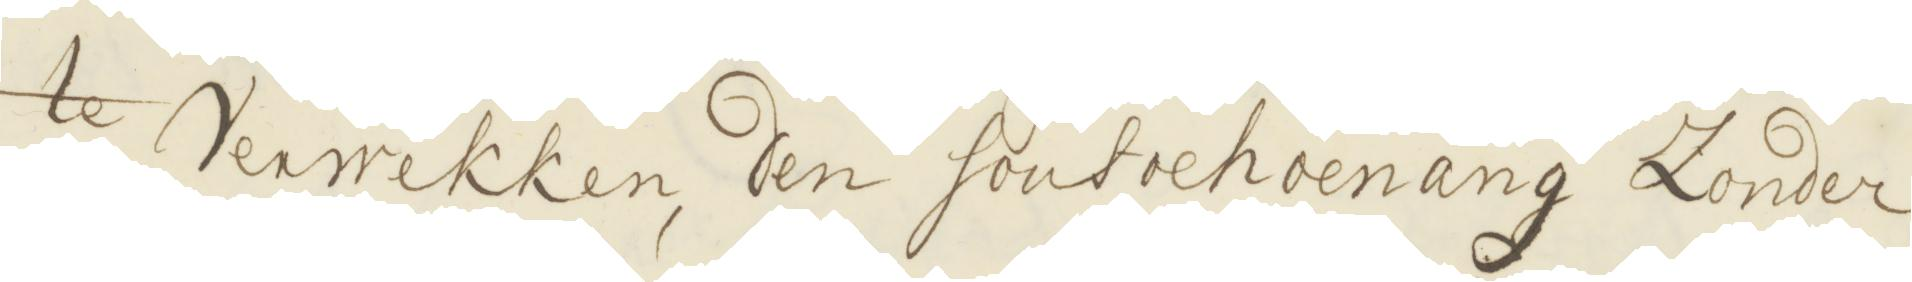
te verwekken, den sousoehoenang zonder
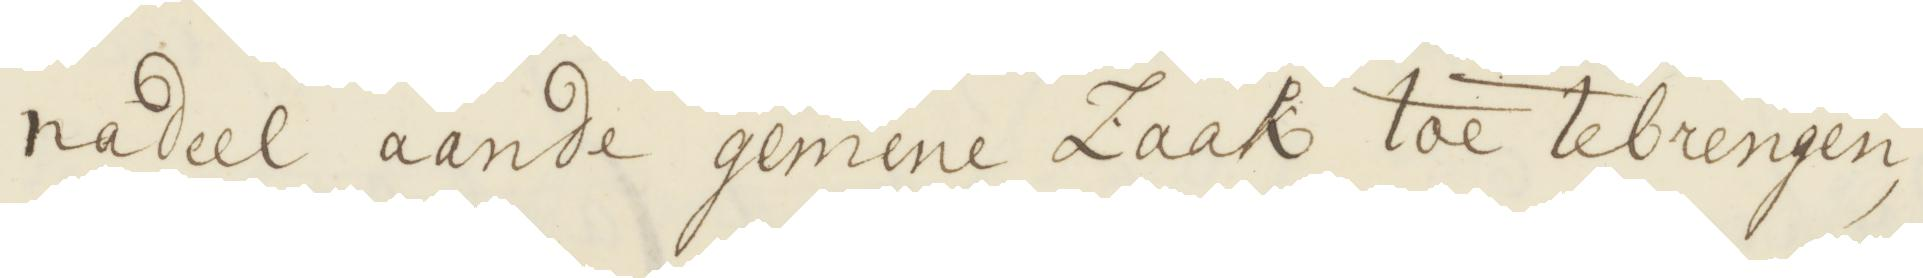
nadeel aande gemene zaak toe tebrengen,
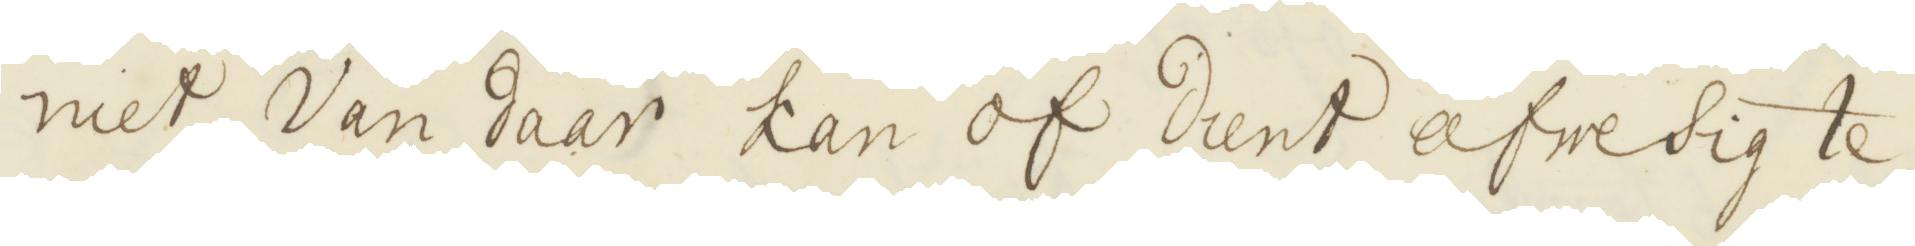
niet van daar kan of dient afwesig te
